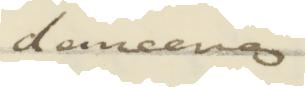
dencelven
